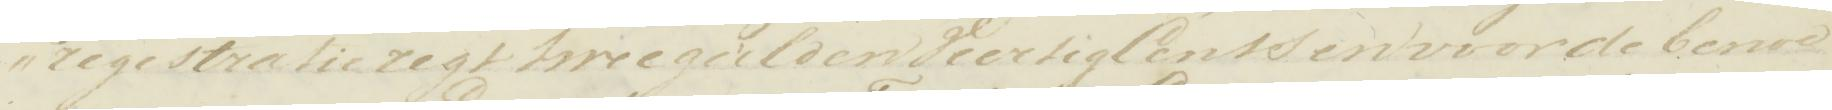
„registratie regt twee gulden Veertig Cents en voor de benoe
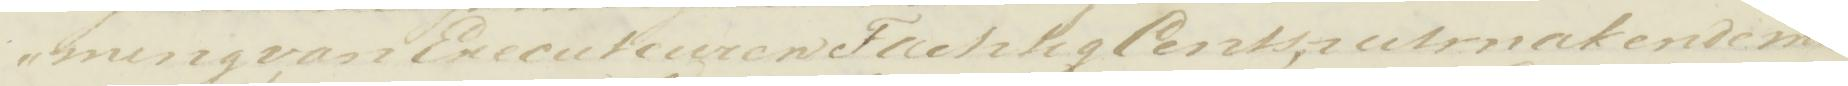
„ming van Executeuren Tachtig Cents, uitmakende met
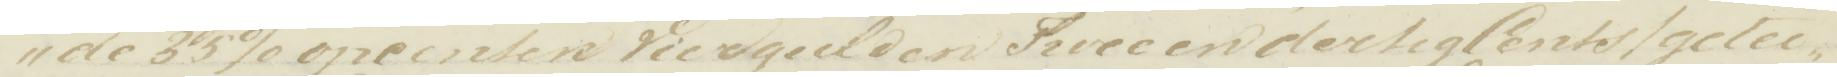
„de 35 % opcenten Vier gulden Twee en dertig Cents / getee„
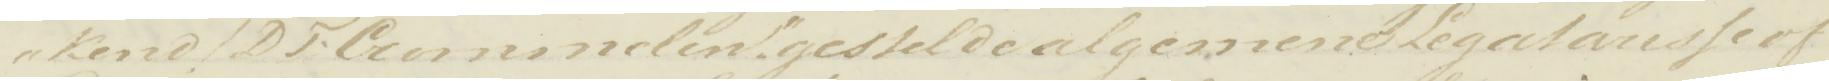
„kend: D F Crommelin, gestelde algemene Legatarisse of
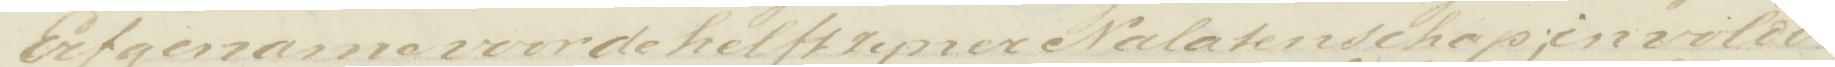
Erfgename voor de helft zyner Nalatenschap, en volder
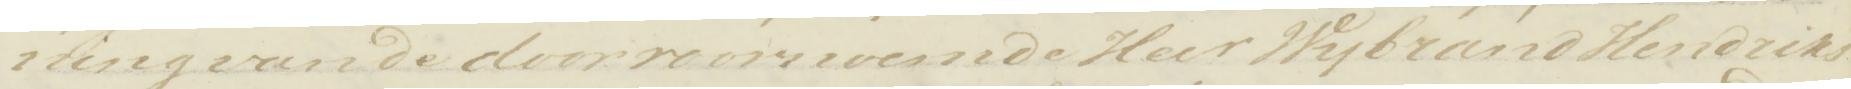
sting van de door voornoemde Heer Wybrand Hendriks
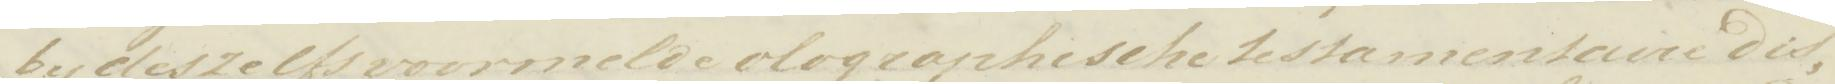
by deszelfs voormelde olographische testamentaire dis„
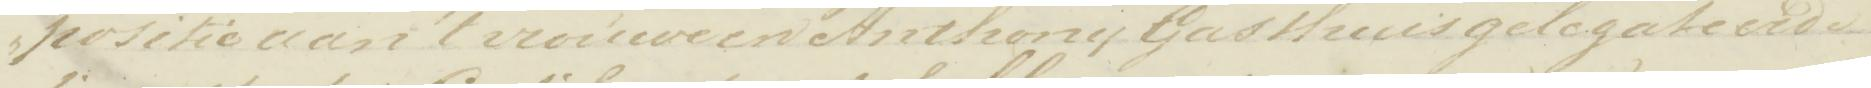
„positie aan ’t vrouwe en Anthonis Gasthuis gelegateerde
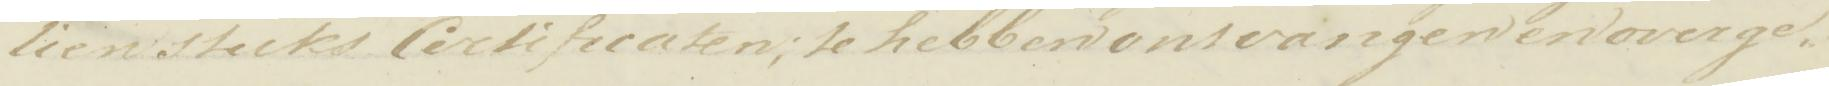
tien stuks Certificaten; te hebben ontvangen en overge„
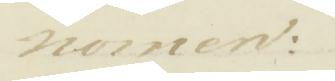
nomen:
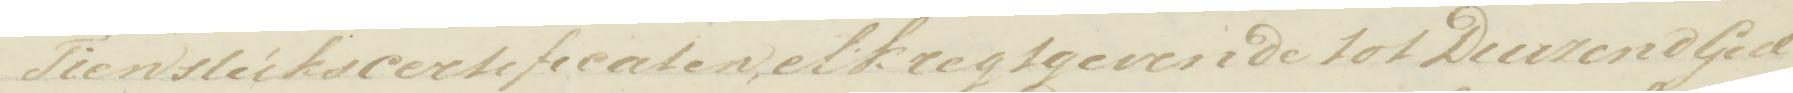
Tien stuks certificaten, elk regtgevende tot Duizend Gul
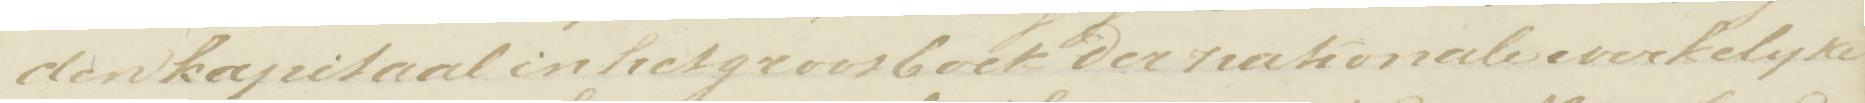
den kapitaal in het grootboek der nationale werkelyke
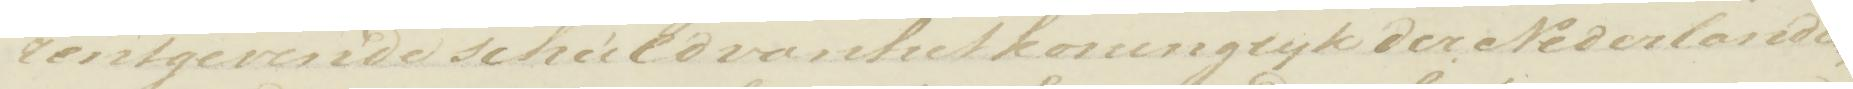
rentgevende schuld van het koningryk der Nederlanden,
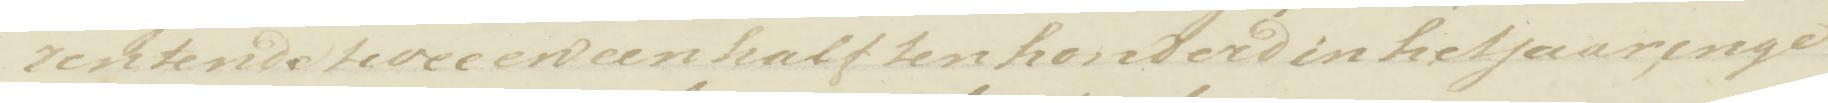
rentende twee en een half ten honderd in het jaar inge
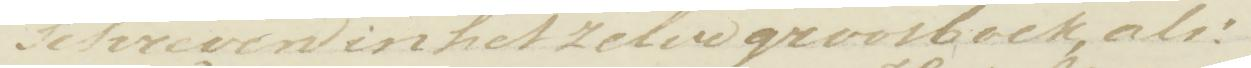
schreven in het zelve grootboek als:
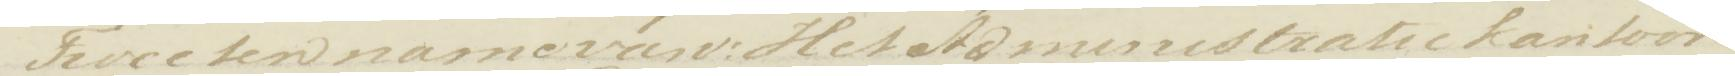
Twee ten name van: Het Administratie kantoor
